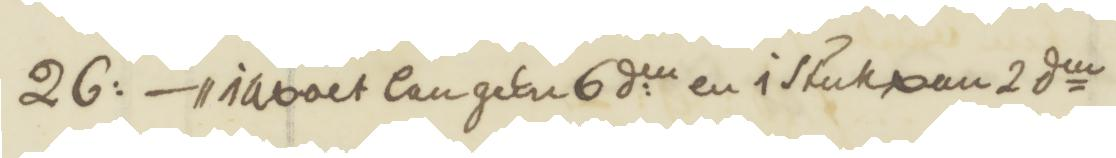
26: —„ 14 voet lange en 6 d:m en 1 stuk van 2 d=m
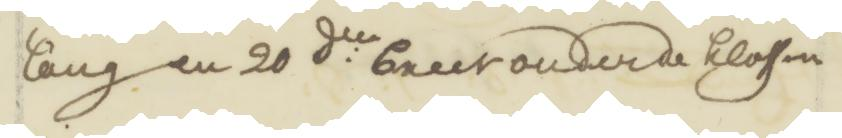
lang en 20 d:m breet onder de klossen
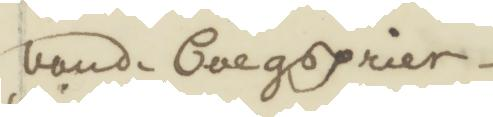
vande boegspriet
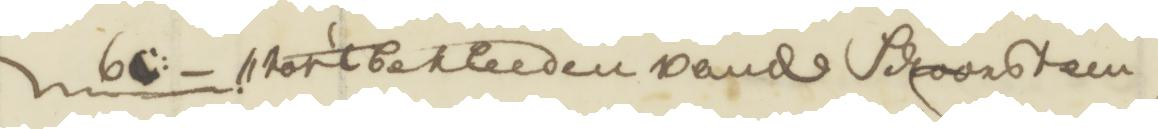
65': — „tot't bekleeden vande Schoorsteen
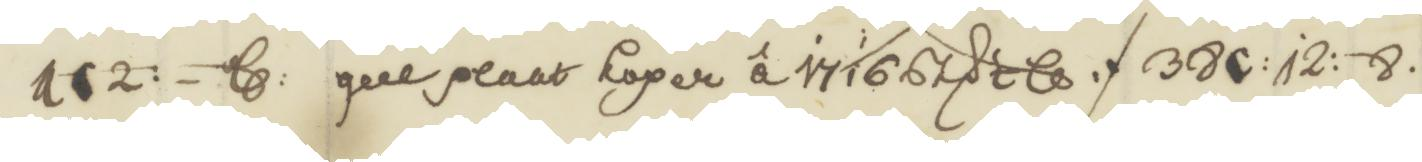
452: — lb: geel plaat koper â 17 1/16 stvers lb .ƒ 385: 12: 8.
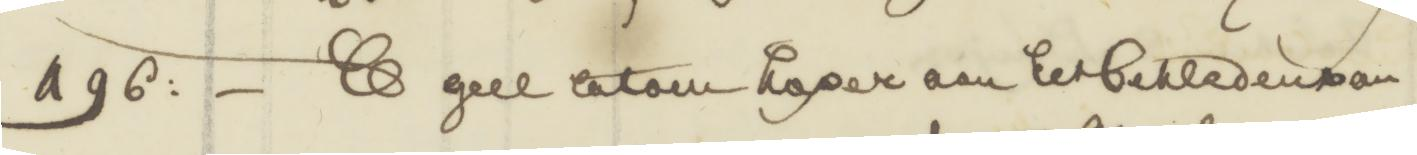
496:— lb geel latoen koper aan het bekleden van
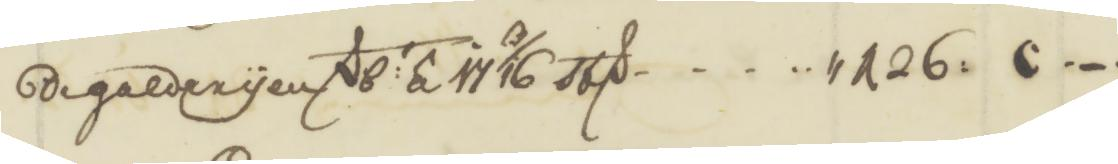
degalderijen verb:t â 17 3/16 stver - - - ..„426: 5 .—
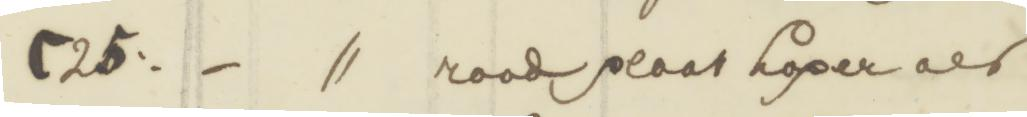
525: — „ rood plaat koper als
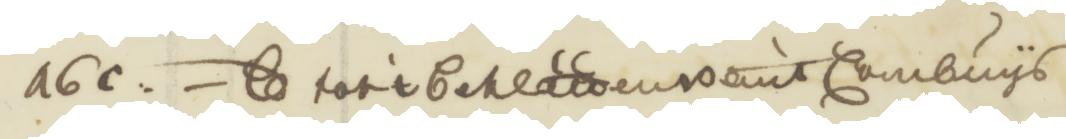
465: — lb tot ’t bekleeden van't Combuijs
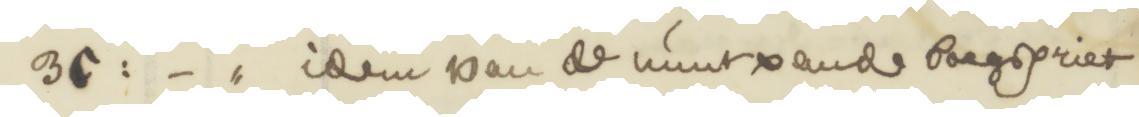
35: — „ idem van de nunt vande boegspriet
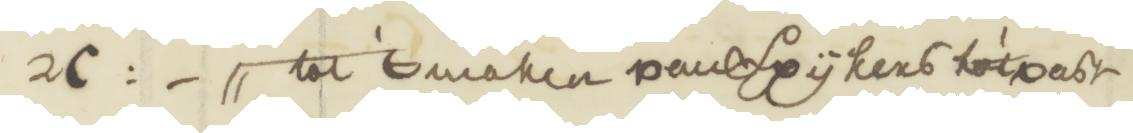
25: — „ tot 'tmaken van spijkers tot vast
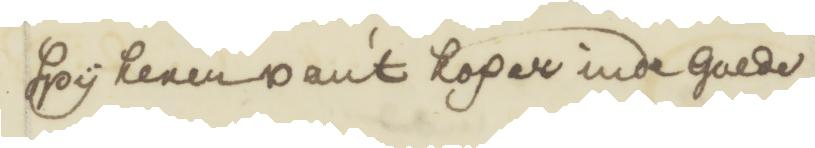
spijkeren van ’t koper inde galde
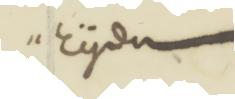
„rijen
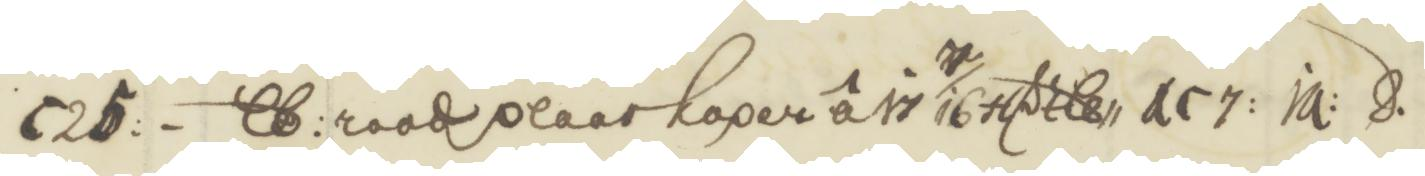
525: — lb: rood plaat koper â 17 7/16 stver lb„ 457: 14: 8.
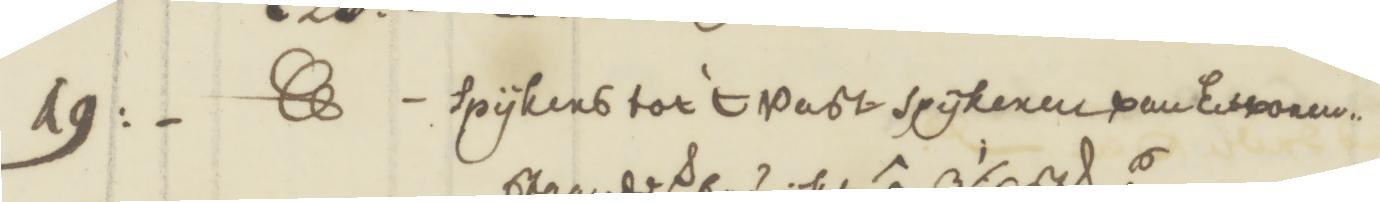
49: — lb - spijkers tot ’t vast spijkeren van hiervoren„
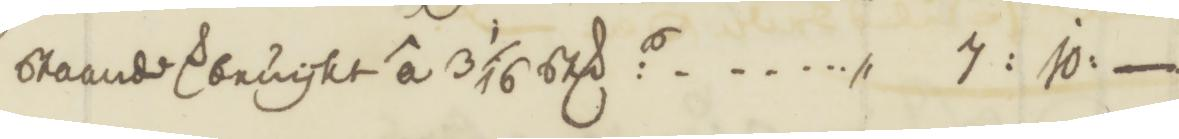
staande verbruijkt â 3 1/16 stver:s - - - . . .„ 7: 10: —
